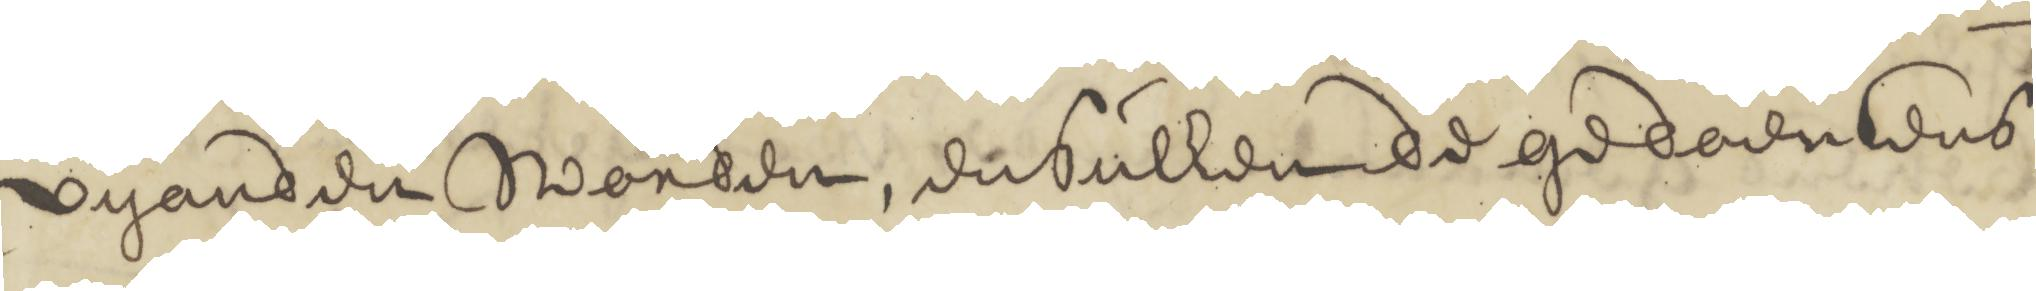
vijanden worden, en sullen de gedaentens
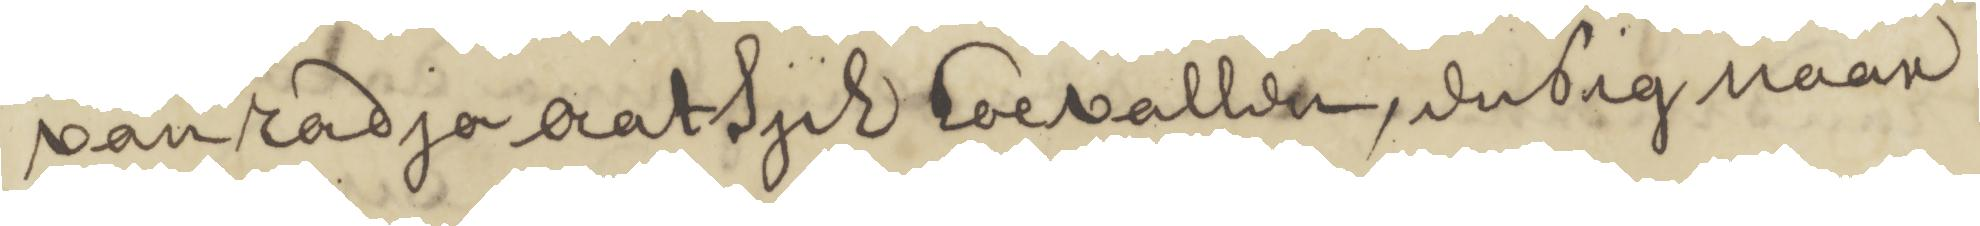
van radja aatsjih toevallen, en sig naar
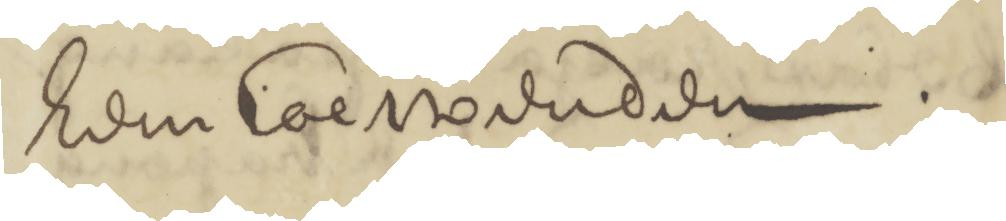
hem toewenden.
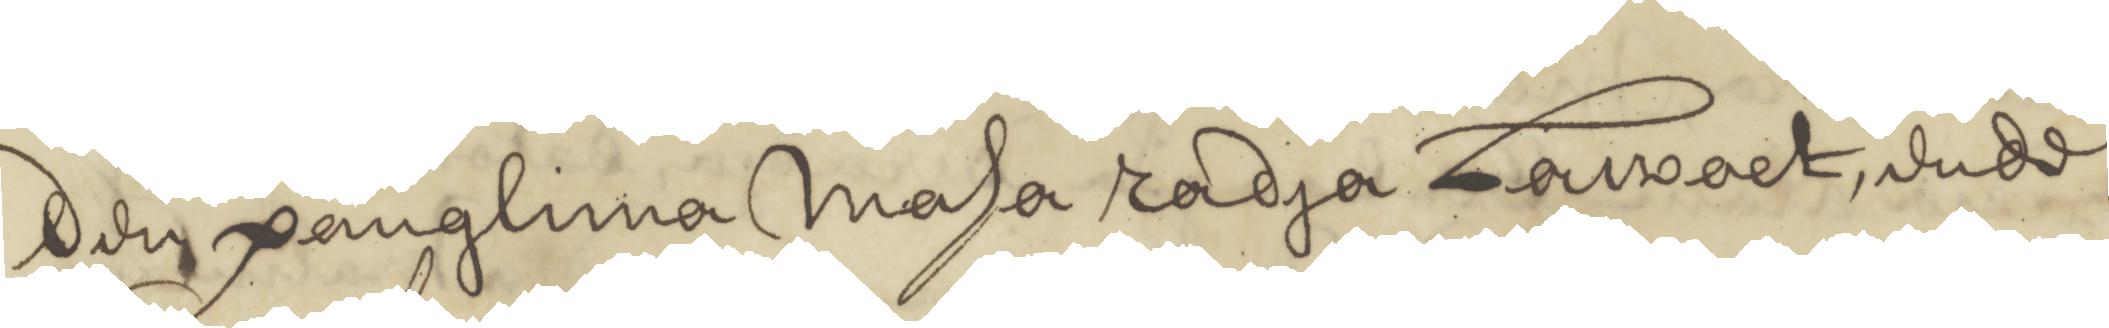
den panglima maja radja Lawoet, ende
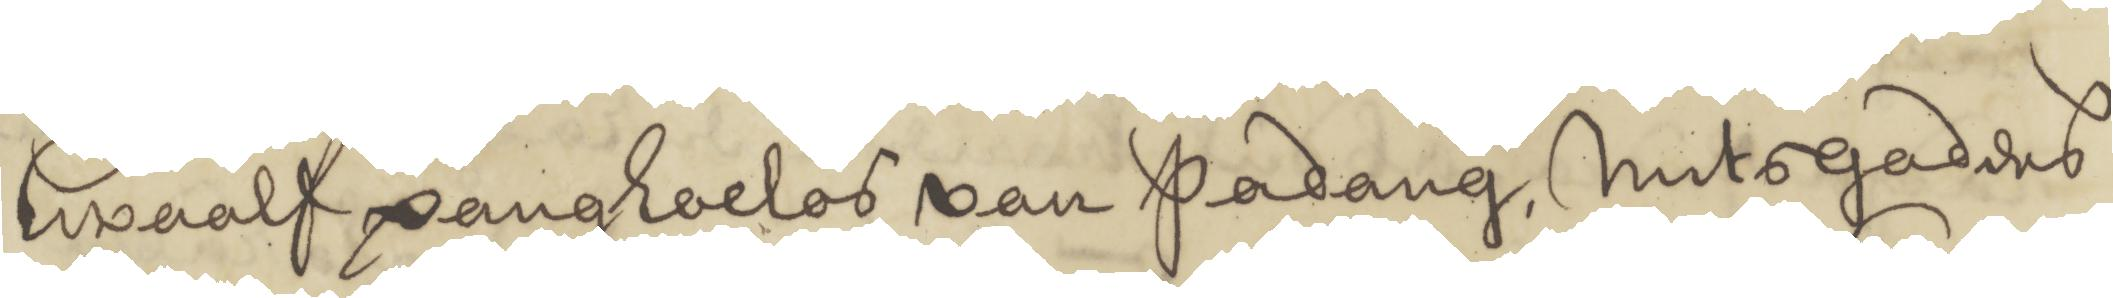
twaalf panghoelos van padang, mitsgaders
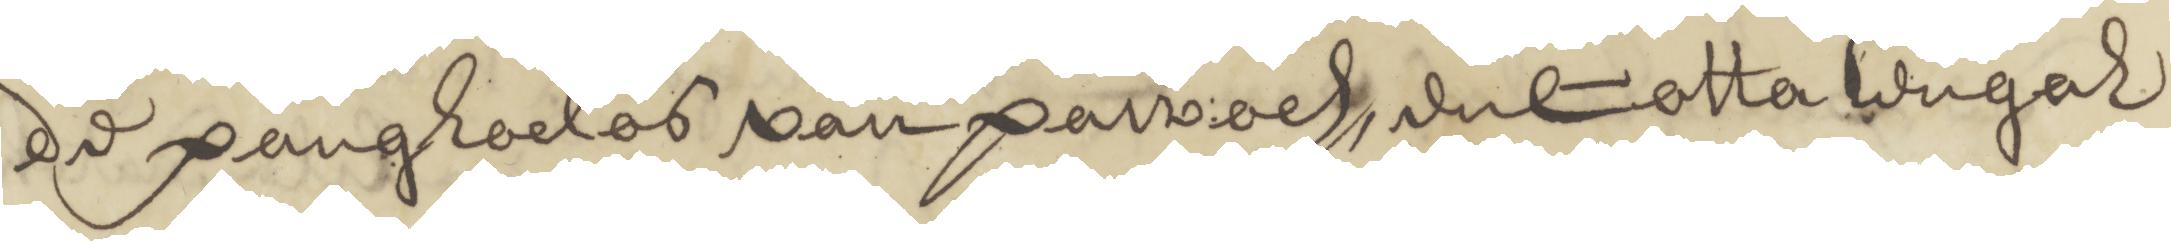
de panghoelos van paw:oeh, en Cotta tengah
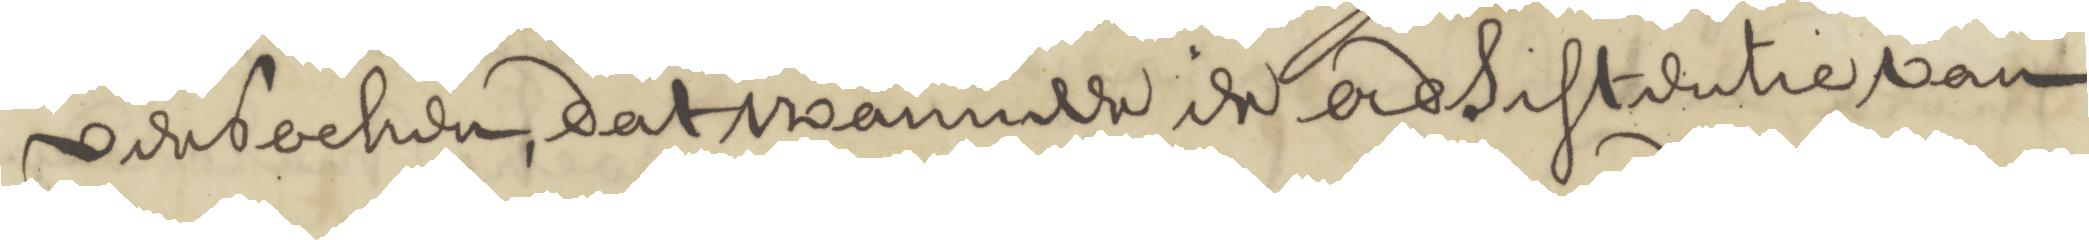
versoeken, dat wanneer er adsistentie van
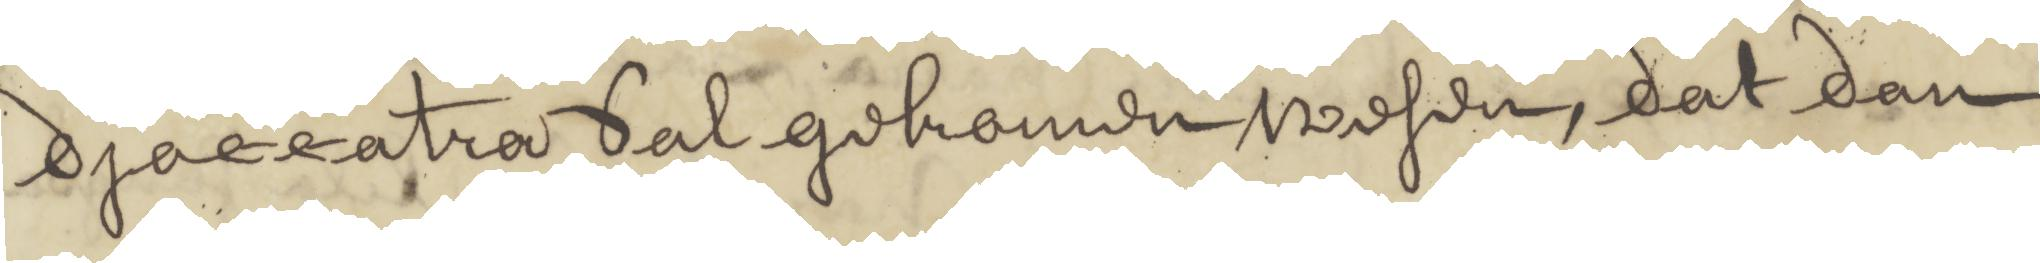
djaccatra sal gekomen wesen, dat dan
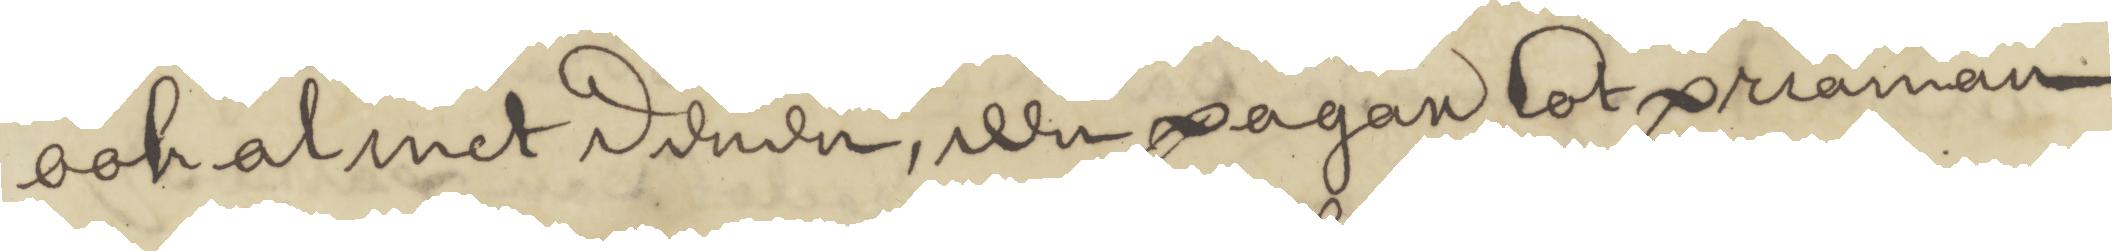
ook al met Eenen, een pagar tot priaman
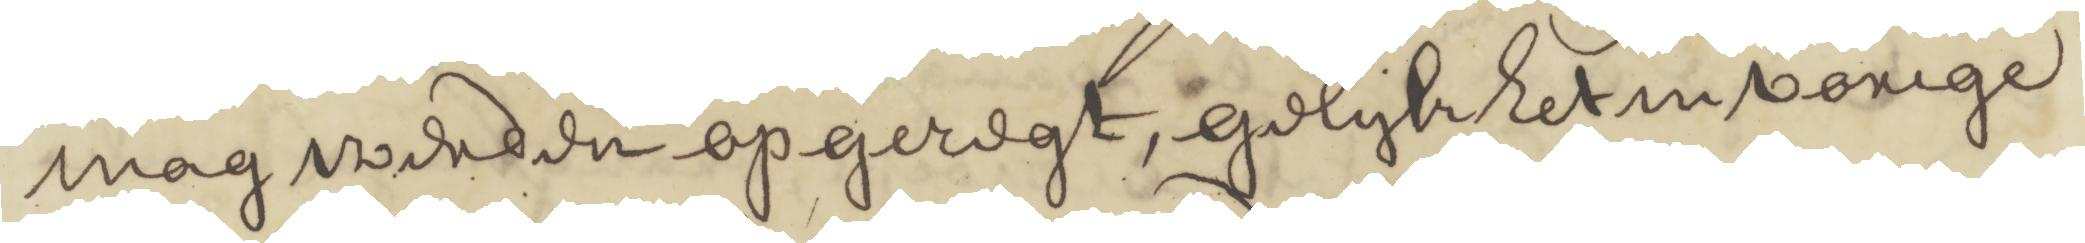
mag werden opgeregt, gelijk het in vorige
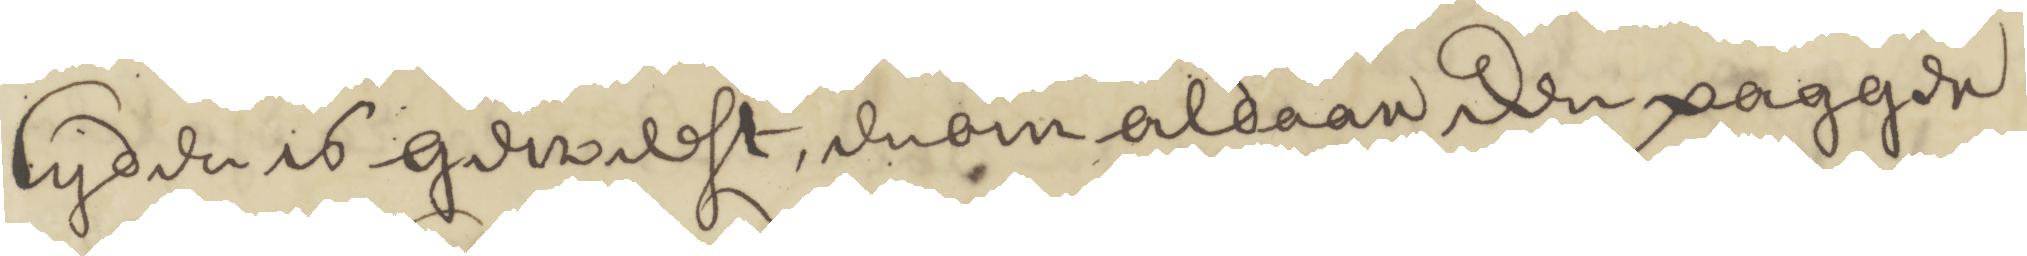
tijden is geweest, en om aldaar Een pagger
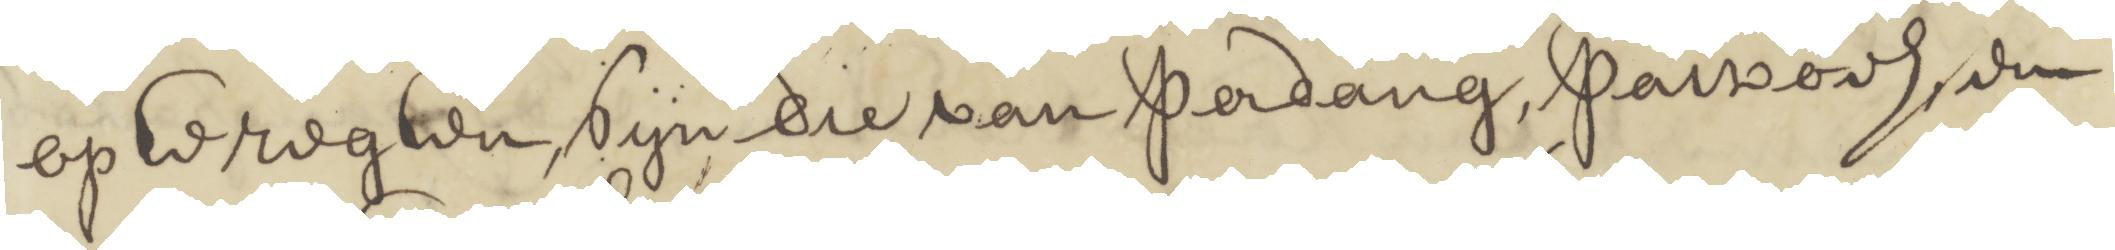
op te regten, sijn die van padang, pawoeh, en
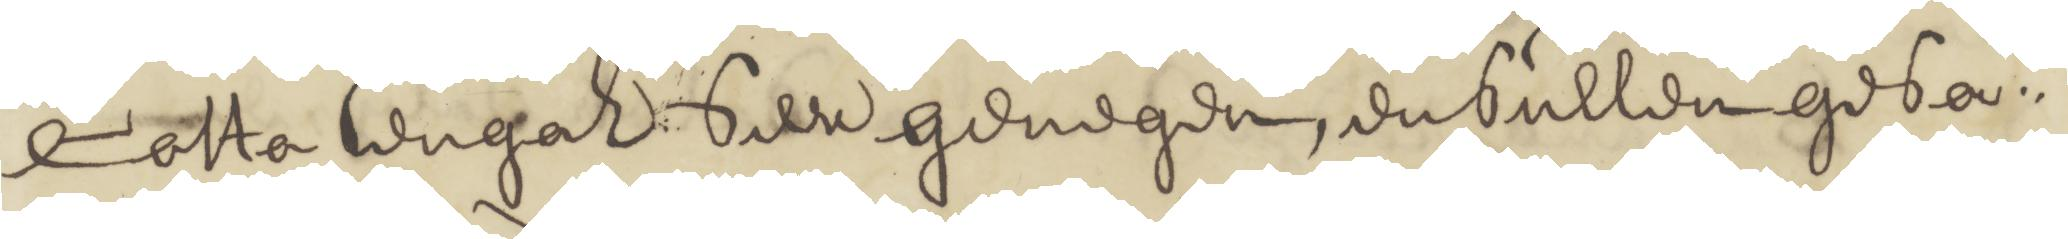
Cotta tengah: seer genegen, en sullen gesa„
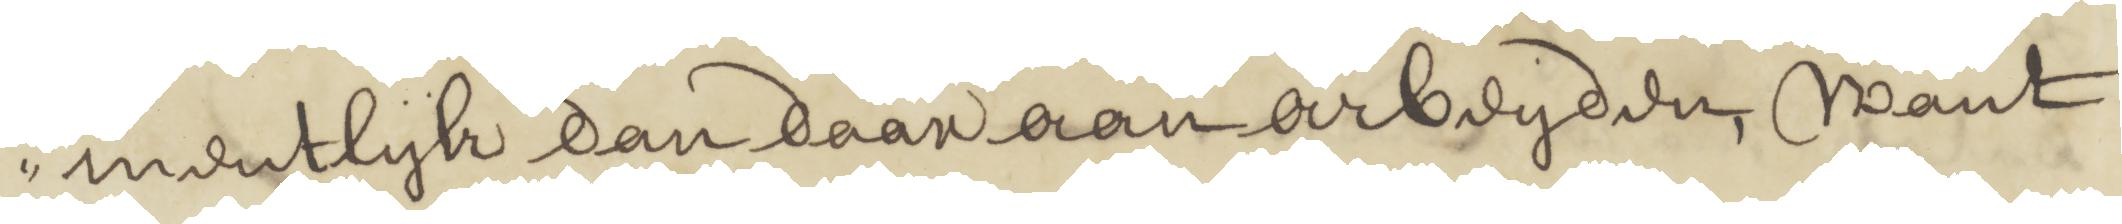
„mentlijk dan daar aan arbeijden, want
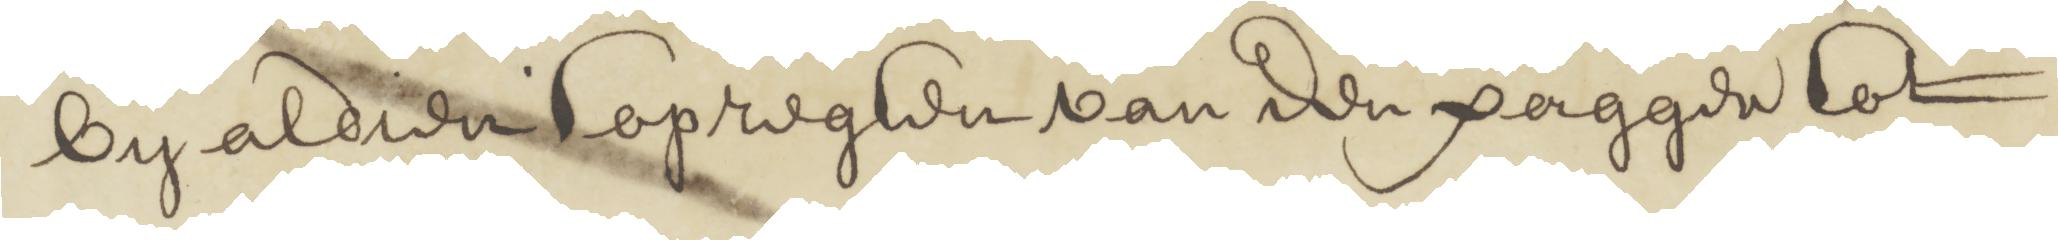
bij aldien ’t opregten van een pagger tot
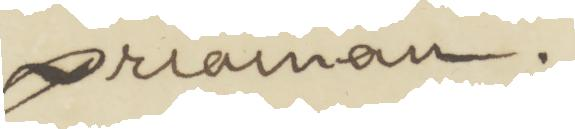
priaman.
